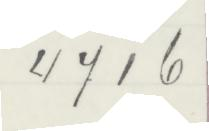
4716
